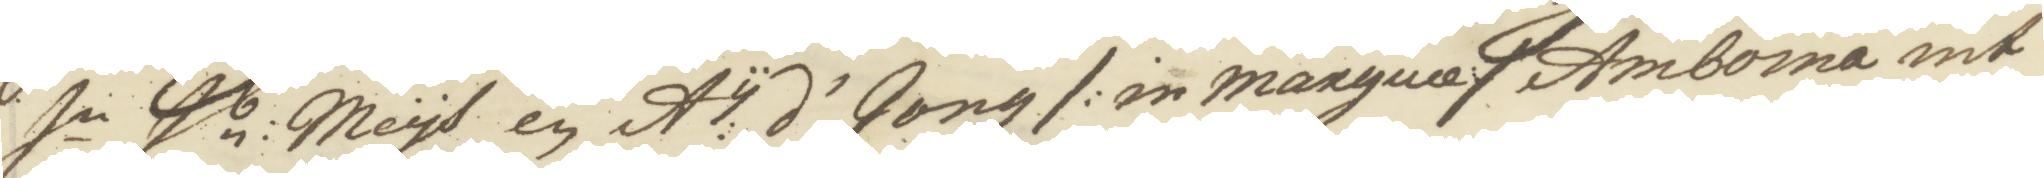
J–n J„b: Meijs en A:ij d’ Jong /:in margine:/ Amboina int
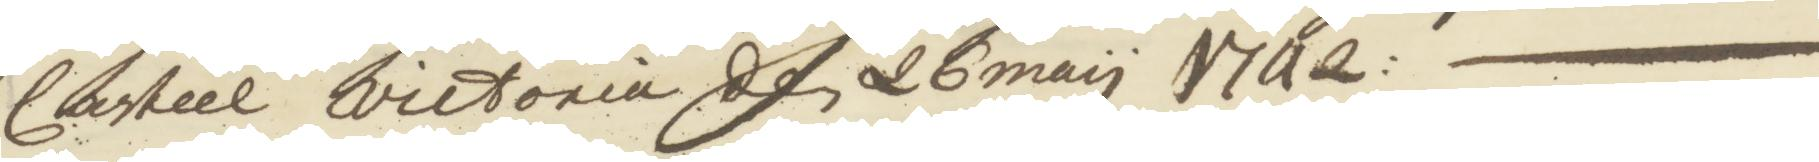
Casteel victoria den 26 maij 1742: —
